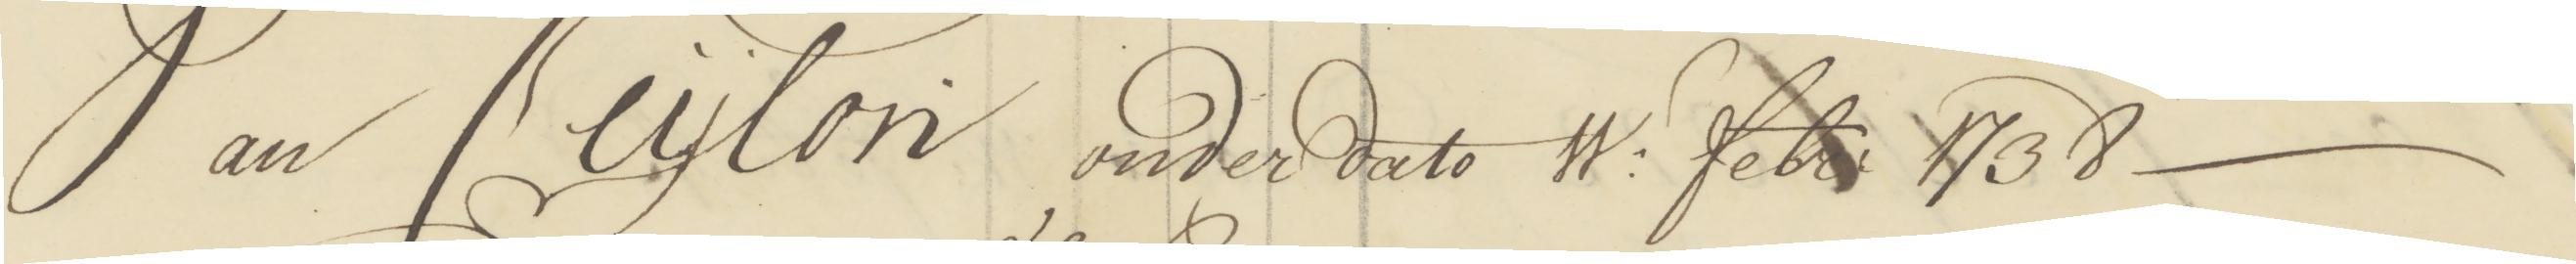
Van Ceijlon onder dato 11:' febr: 1738 —
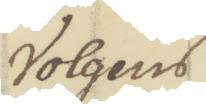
Volgens
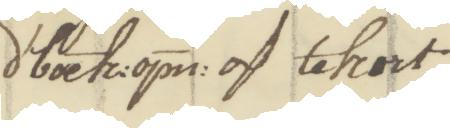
d' boek: opn: over tekort
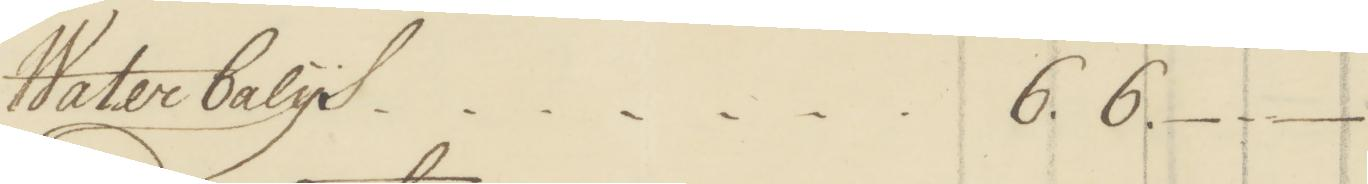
Water balijs - - - - - - - 6. 6. —. —
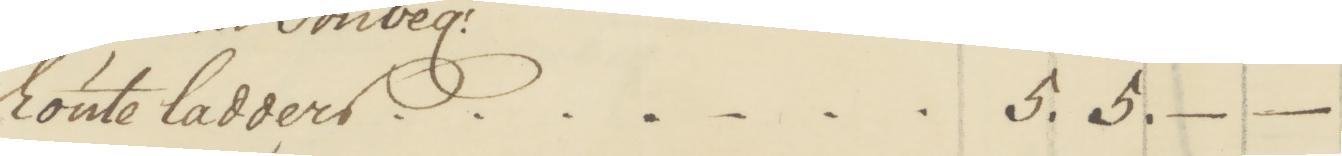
houte ladders - - - - - - - 5. 5. — —
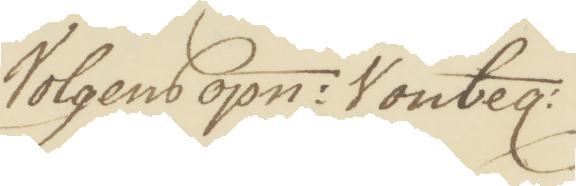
Volgens opn: 1 onbeq:
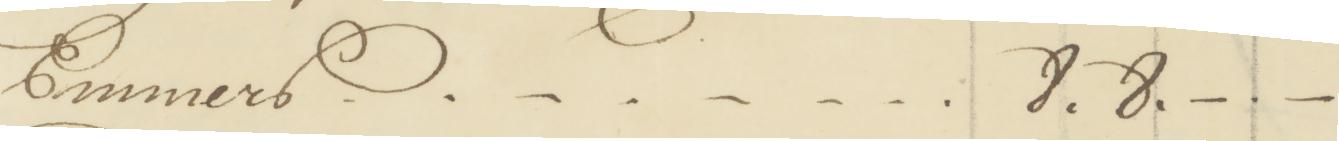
Emmers - - - - - - - - 8. 8. —. —
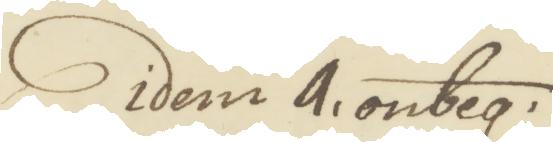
idem 4. onbeq:
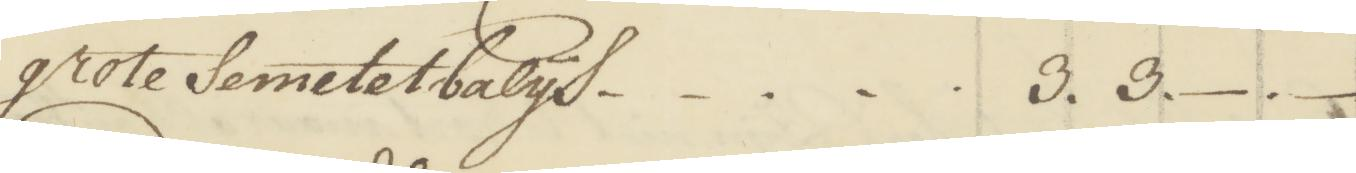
grote semetetbalijs - - - - - 3. 3. —. —
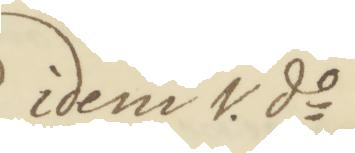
idem 1. d=o
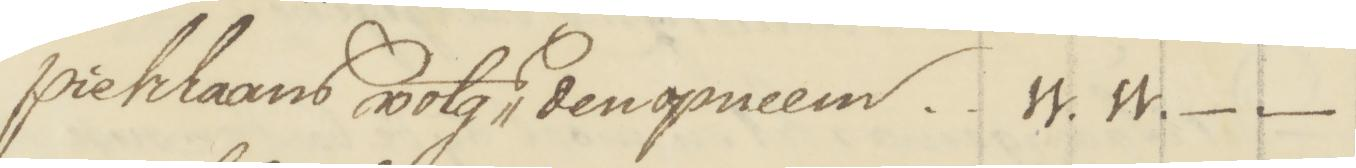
piekhaans volg„s den opneem - - 11. 11. —. —
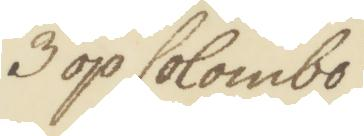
3 op Colombo
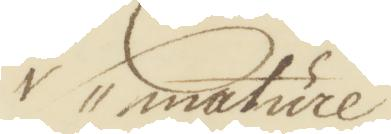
1 „ mature
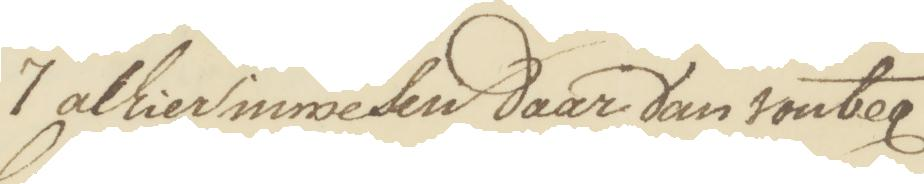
7 alhier inwesen daar dan 1 onbeq
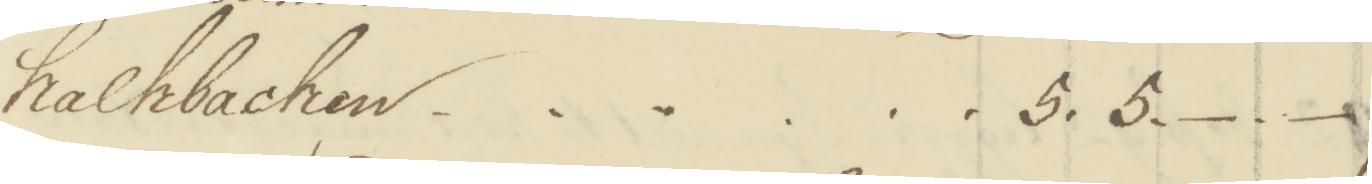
kalkbacken - - - - - - 5. 5. —. —
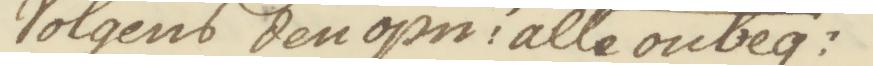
Volgens den opn: alle onbeq:
